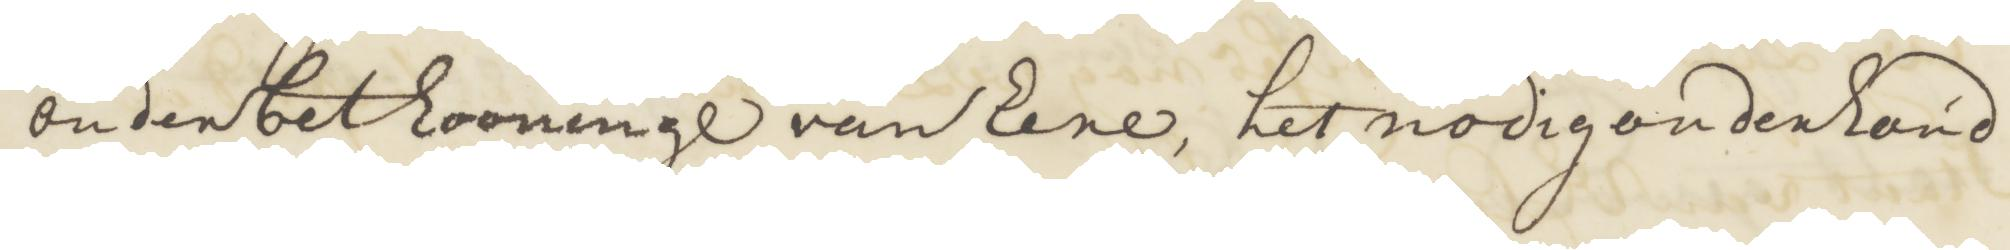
onder bethooninge van Eere, het nodig onderhoud
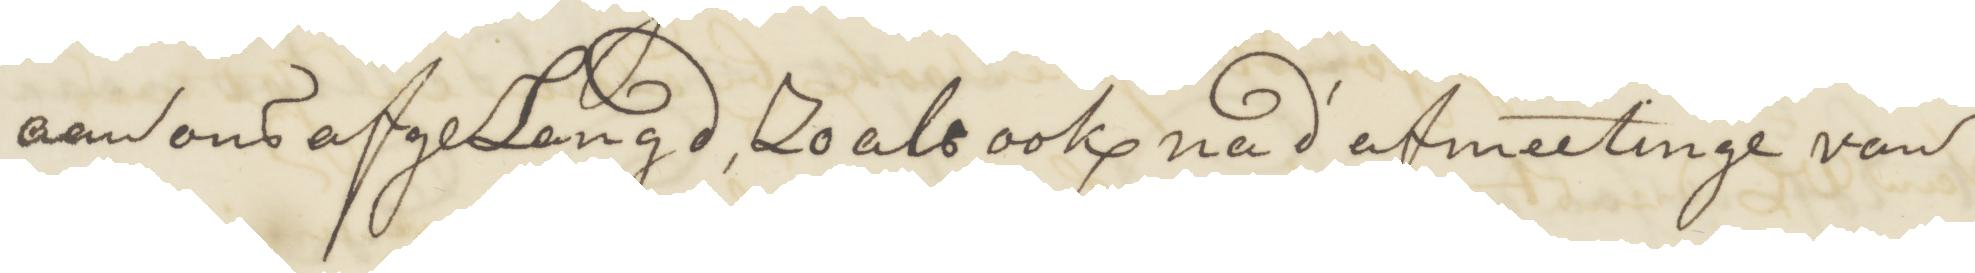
aan ons afgelangd, Zoals ook na d’ afmeetinge van
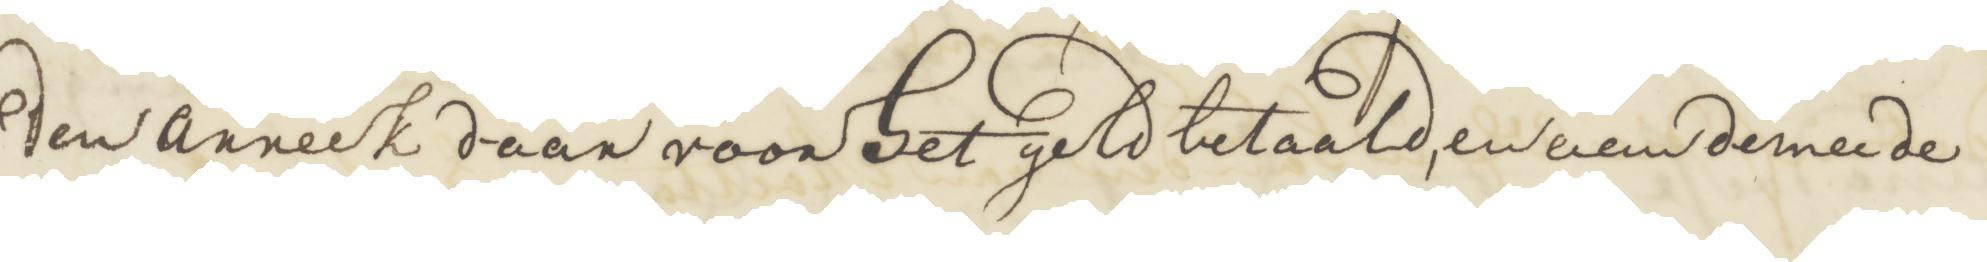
den arreek daar voor het geld betaald, en aan de meede
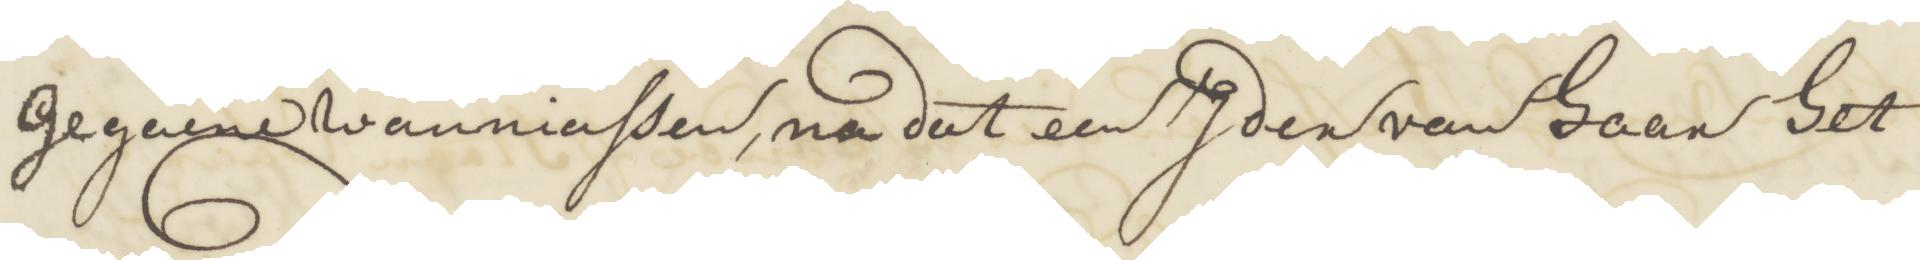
gegevene wanniassen, na dat een jder van haar het
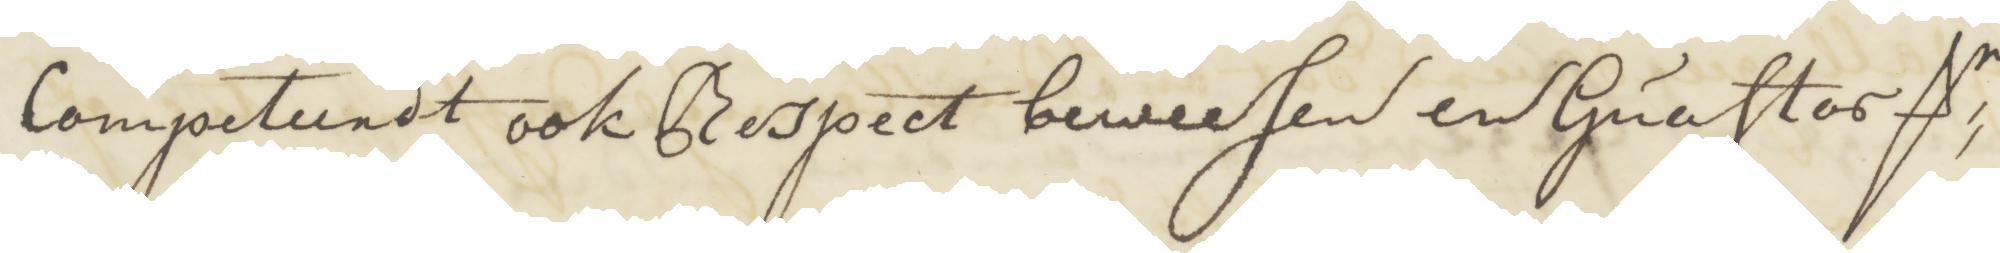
Competeerdt ook Respect beweesen en Guastos ver„
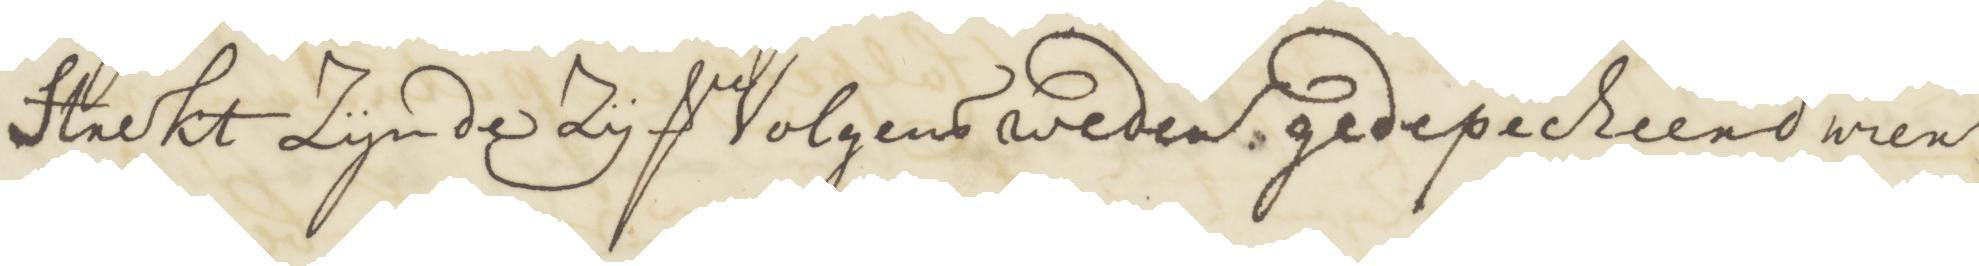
strekt Zijnde Zij vervolgens weder, gedepecheerd wier
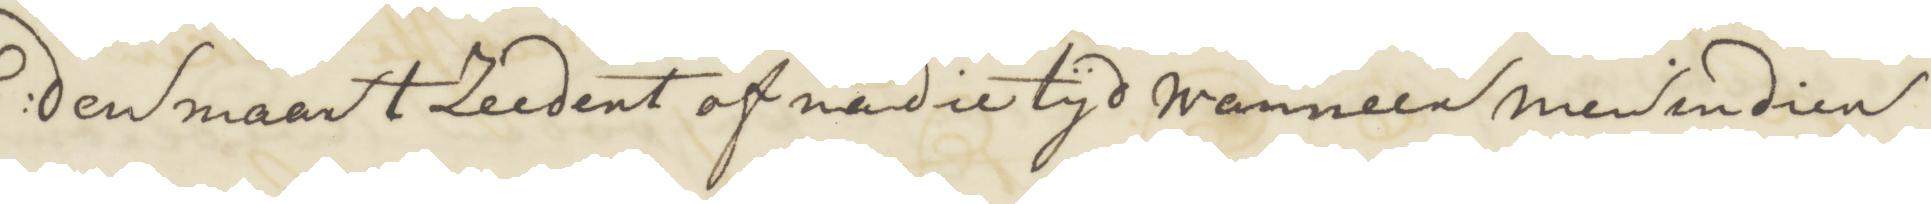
:den maar 't Zeedert of na die tijd wanneer men in dier
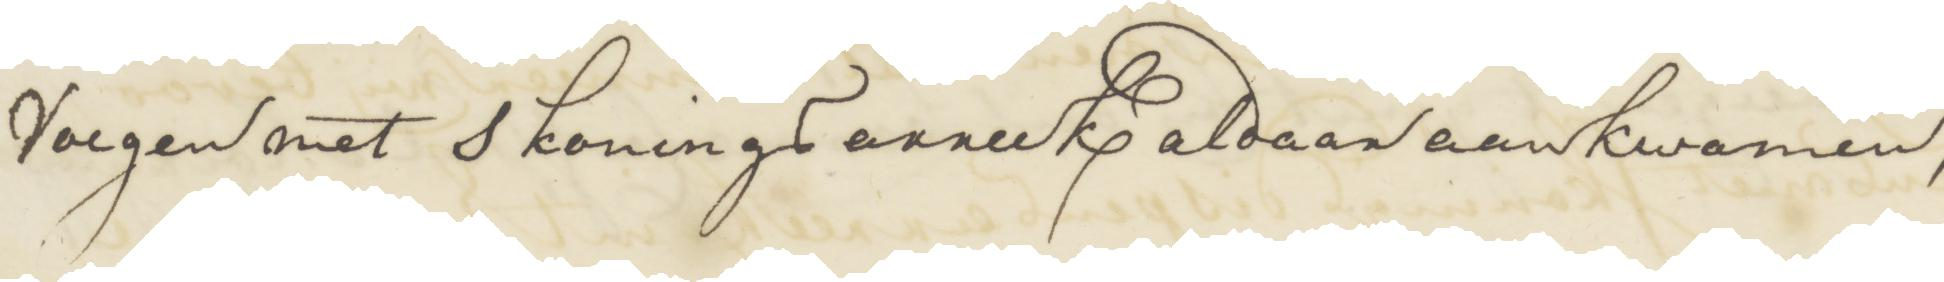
Voegen met ’s konings arreek aldaar aan kwamen,
